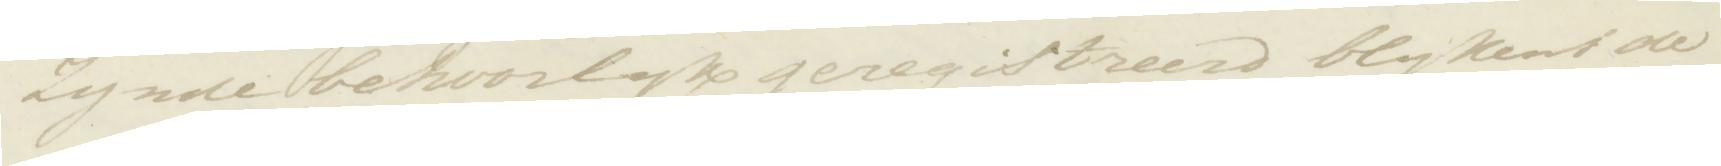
Zynde behoorlyk geregistreerd blykens de
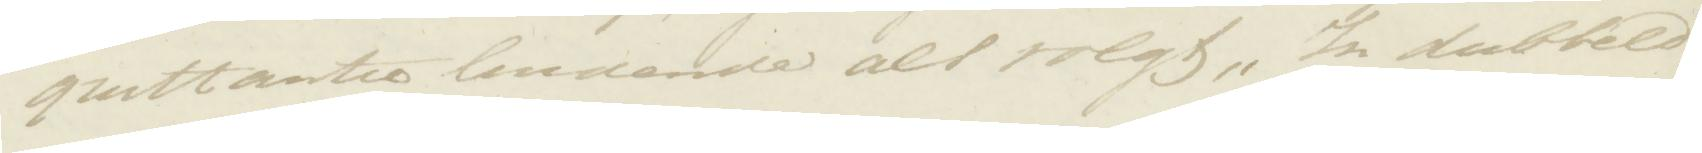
quittantie luidende als volgt „ Jn dubbeld
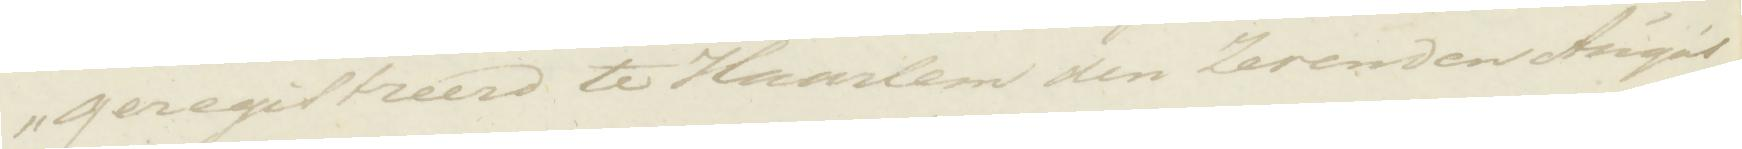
„ geregistreerd te Haarlem den Zevenden Augus,
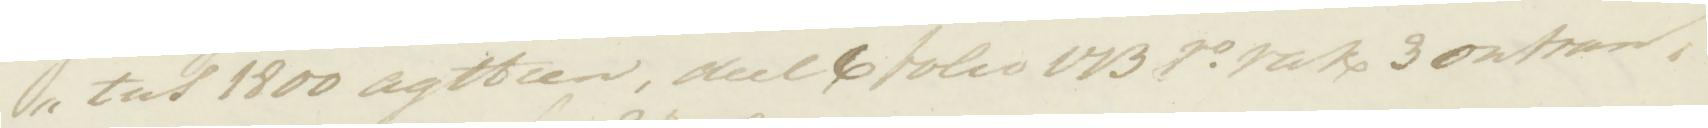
tus 1800 agttien, deel 6 folio 173 v.o vak 3 ontvan,
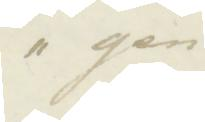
„ gen - - - - - fr. 84„ 80
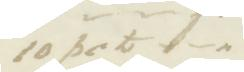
10 pct - -
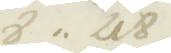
8 „ 48
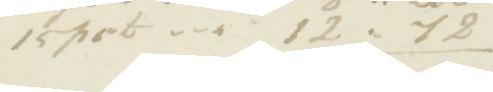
15 pct - - „ 12.„ 72
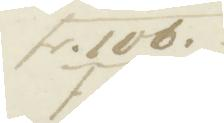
fr. 106.
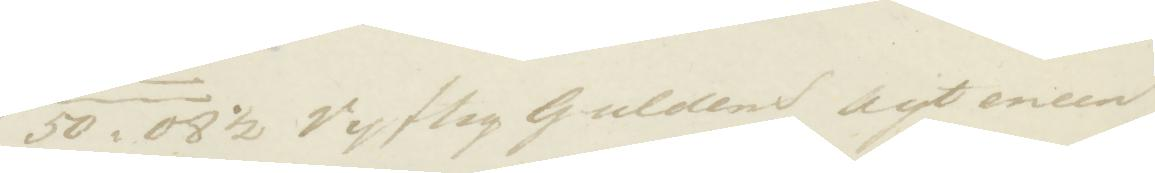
ƒ 50 „ 08½ Vyftig Guldens agt en een
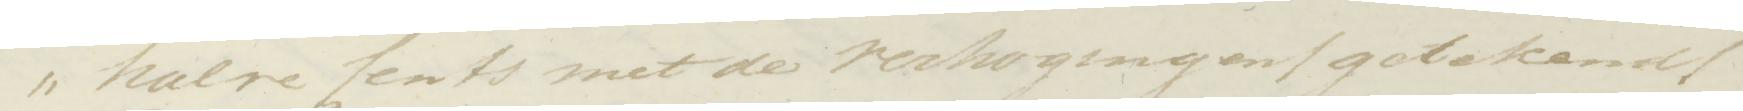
„ halve Cents met de verhogingen /getekend/
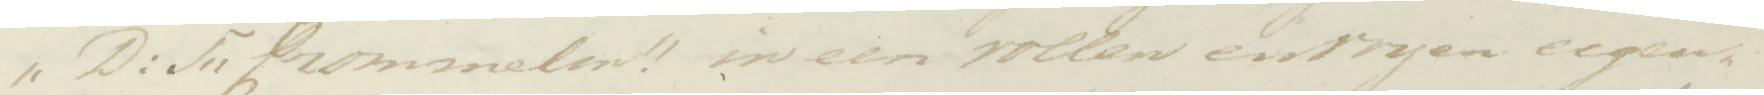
„ D:F Crommelin." in een vollen en vryen eigen„
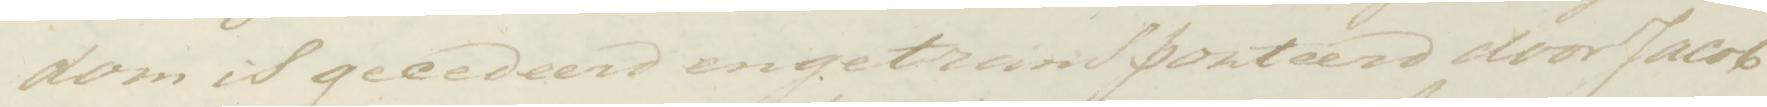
dom is gecedeerd en getransporteerd door Jacob
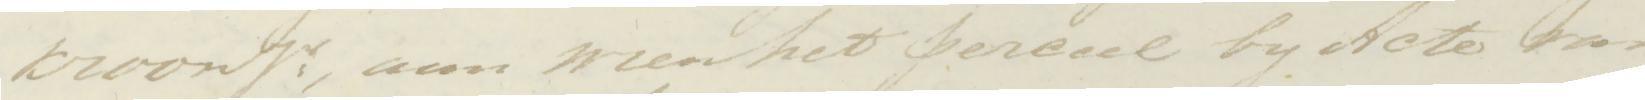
kroons J:r aan wien het perceel by Acte van
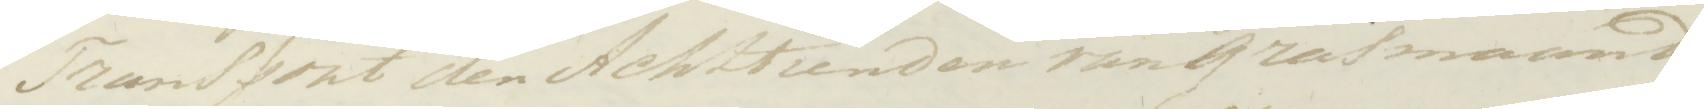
Transport den Achttienden van Grasmaand
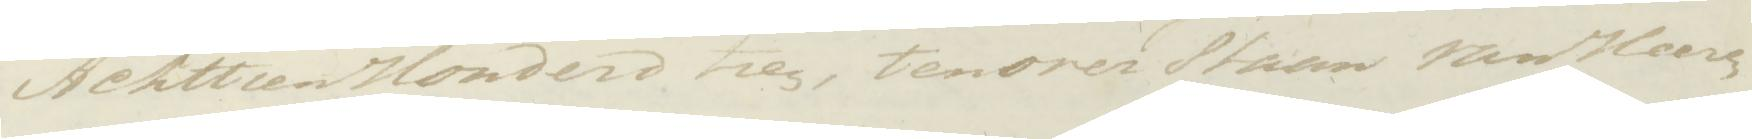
Achttien Honderd tien, ten overstaan van Heeren
